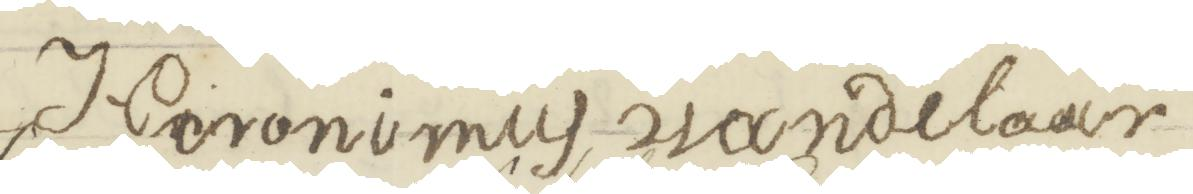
Hironimus wandelaar
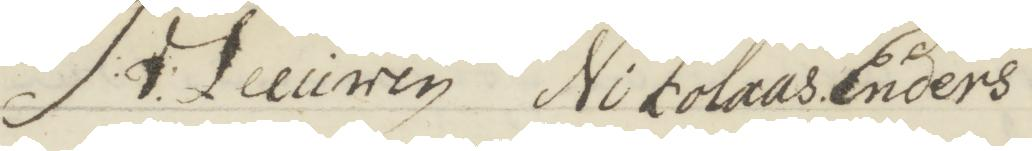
S: v: Leeuwen Nikolaas. Enders
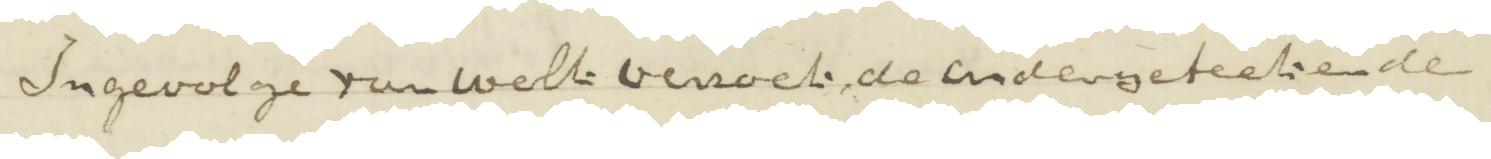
Jngevolge van welk verzoek, de ondergeteekende
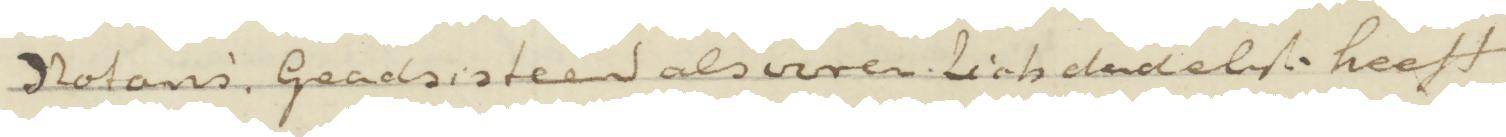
Notaris. Geadsisteerd als voren zich dadelyk heeft
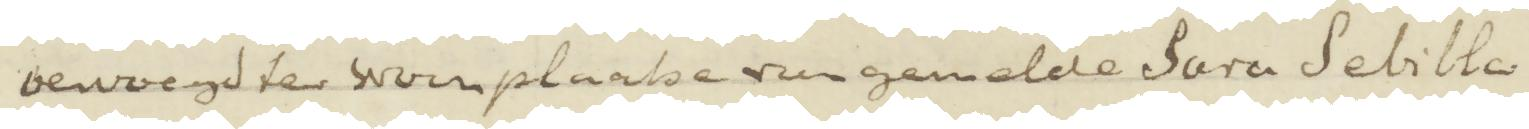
vervoegd ter woonplaats van gemelde Sara Sebilla
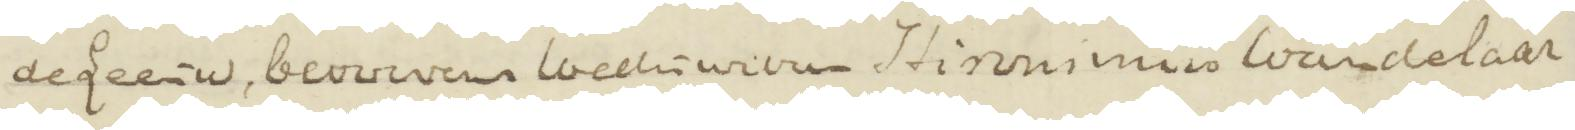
de Leeuw, bevoorens weduwe van Hironimus wandelaar
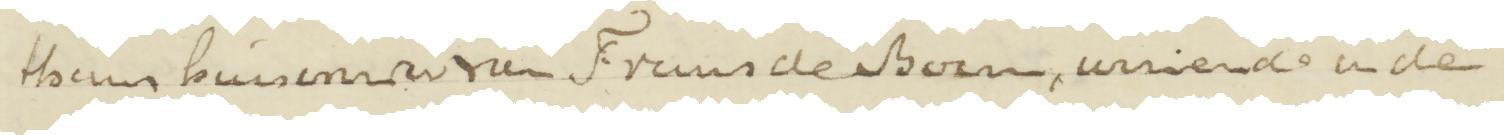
thans huisvrouw van Frans de Boom, wonende in de
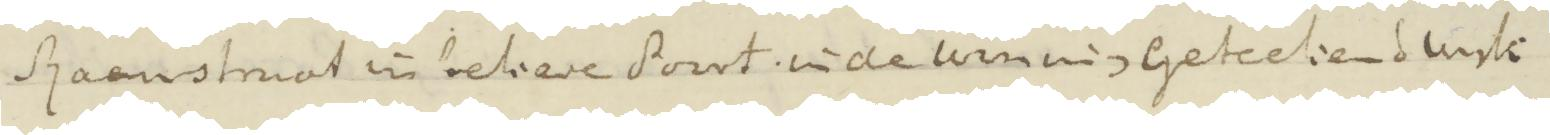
Raamstraat in zekere poort. in de woning Geteekend wyk
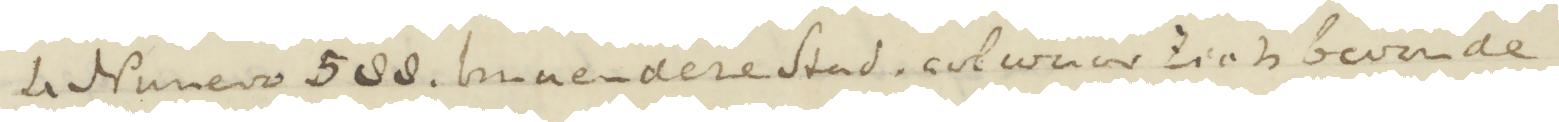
4 Numero 588. binnen deze stad. alwaar zich bevonde
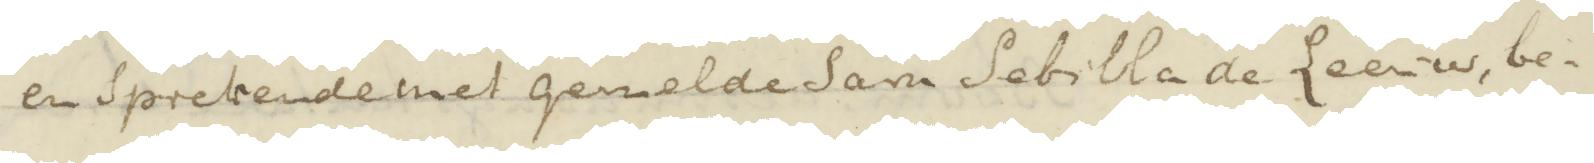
en sprekende met gemelde Sara Sebilla de Leeuw, be-
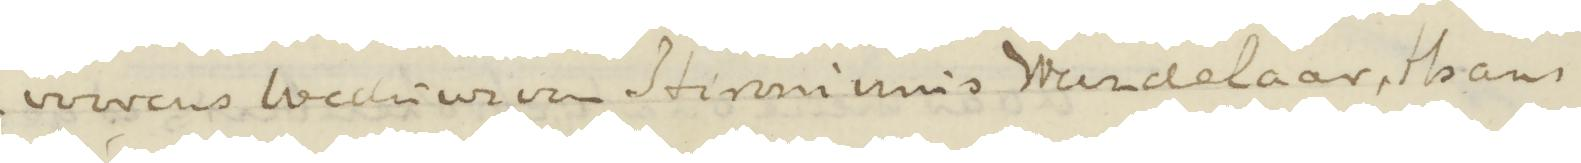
voorens weduwe van Hironimus Wandelaar, thans
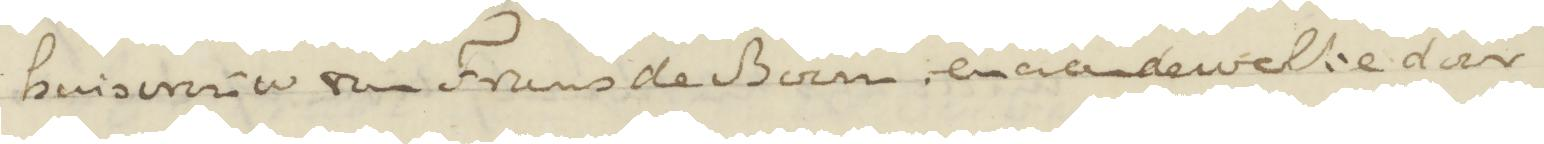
huisvrouw van Frans de Boom, en aan de welke door
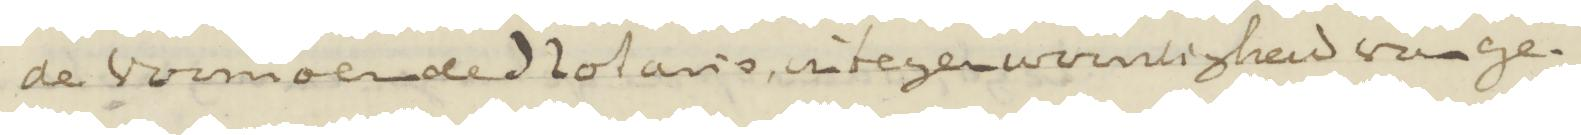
de voomoende Notaris, integenwoonligheid van ge-
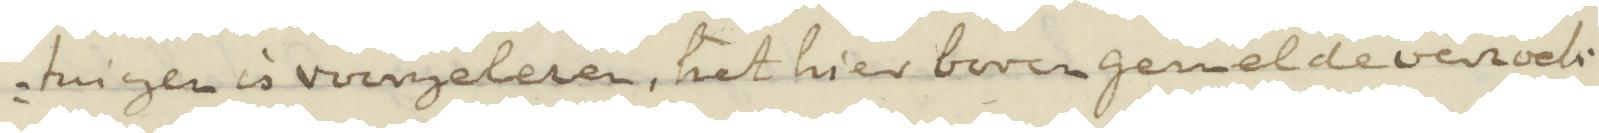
=tuigen is voorgelezen, het hier boven gemelde verzoek
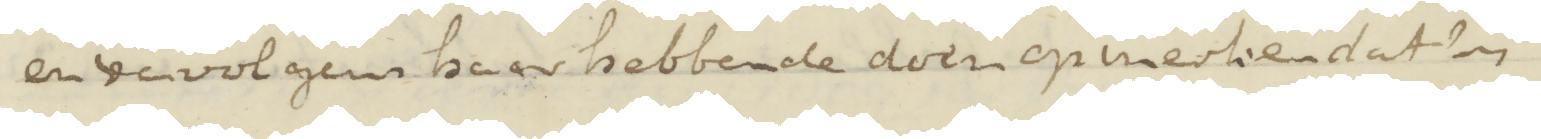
en vervolgens haar hebbende doen opmerken dat zij
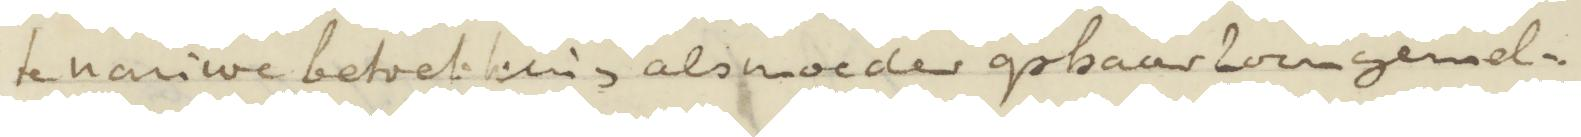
te nauwe betrekking als moeder op haar zoon gemel=
